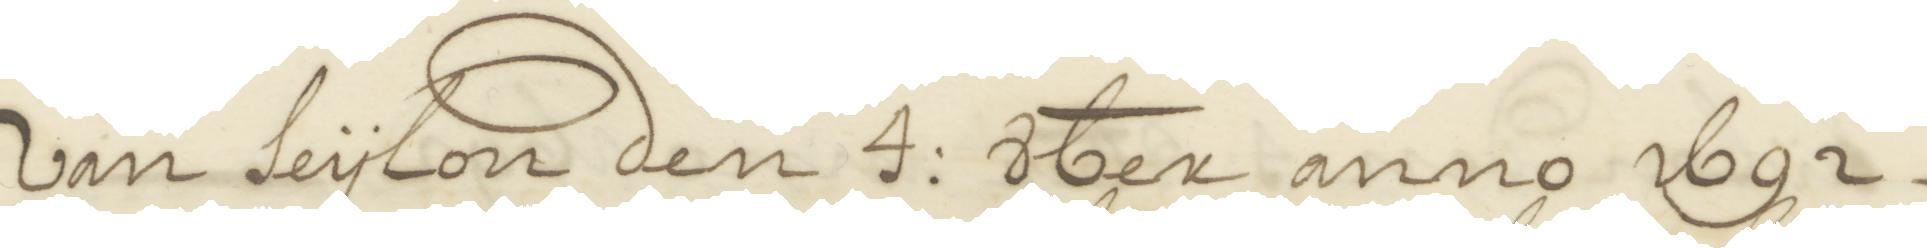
van seijlon den 4: 8ber anno 1692
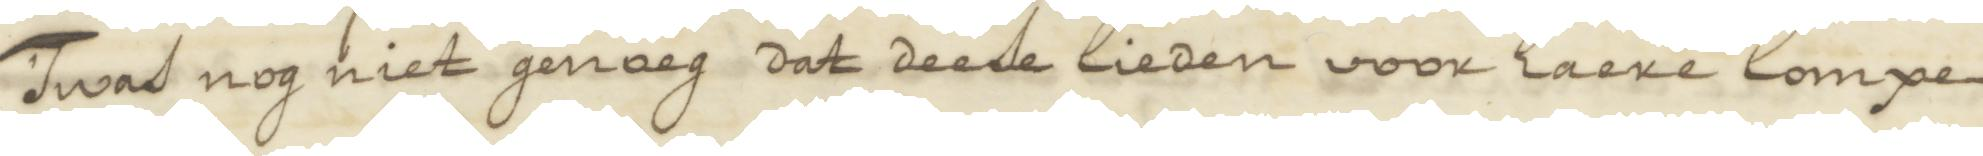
'Twas nog niet genoeg dat deese lieden voor haere lompe
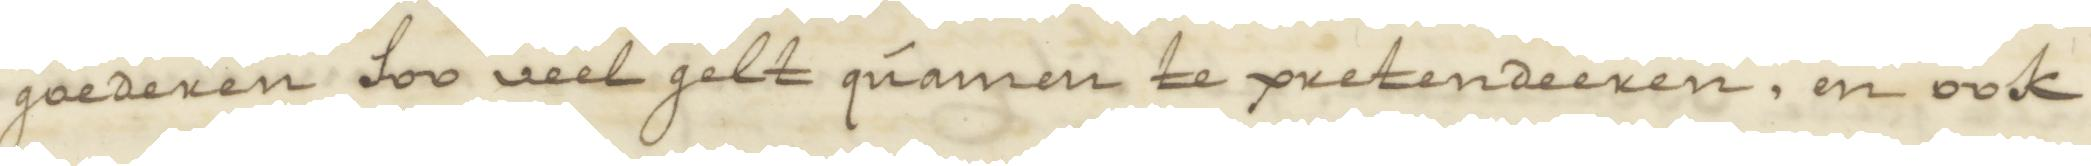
goederen soo veel gelt quamen te pretendeeren, en ook
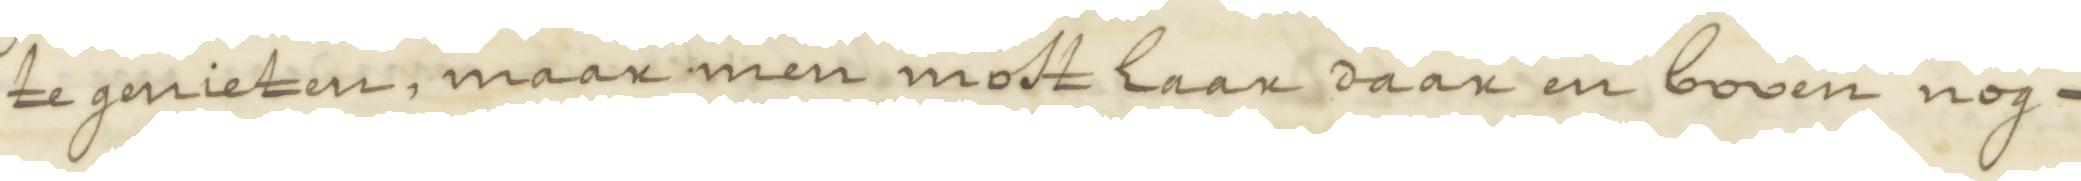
te genieten, maar men most haar daar en boven nog
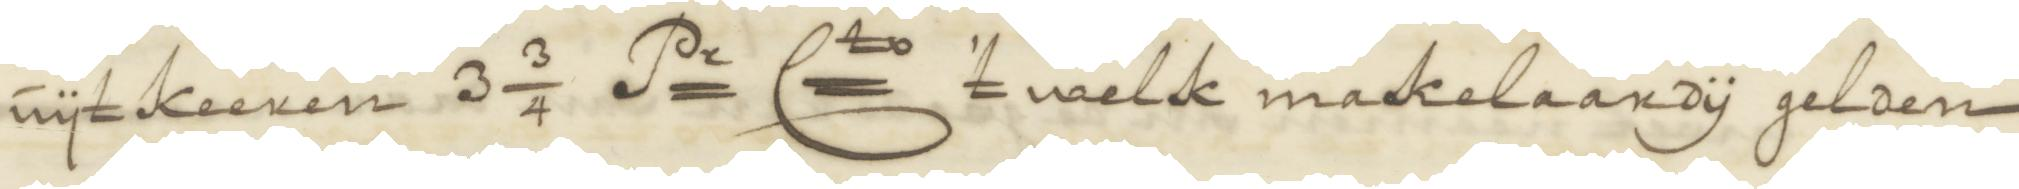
uijt keeren 3¾ P=r C=to 't welk makelaardij gelden
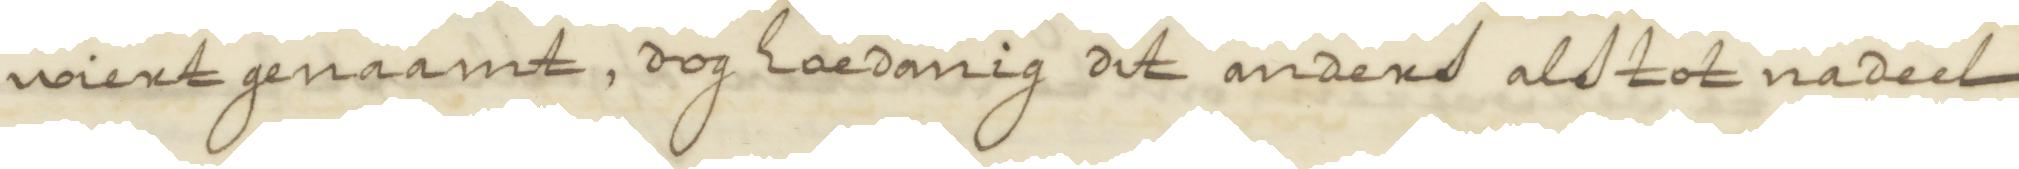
wiert genaamt, dog hoedanig dit anders als tot nadeel
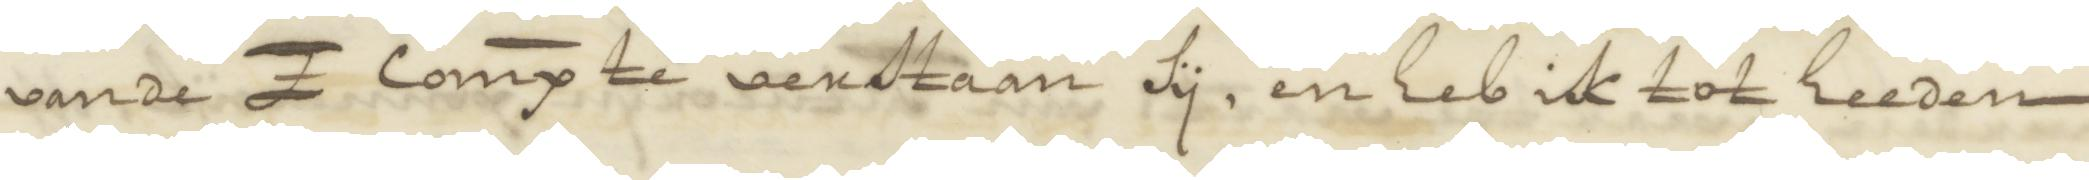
van de E Comp te verstaan sij, en heb ik tot heeden
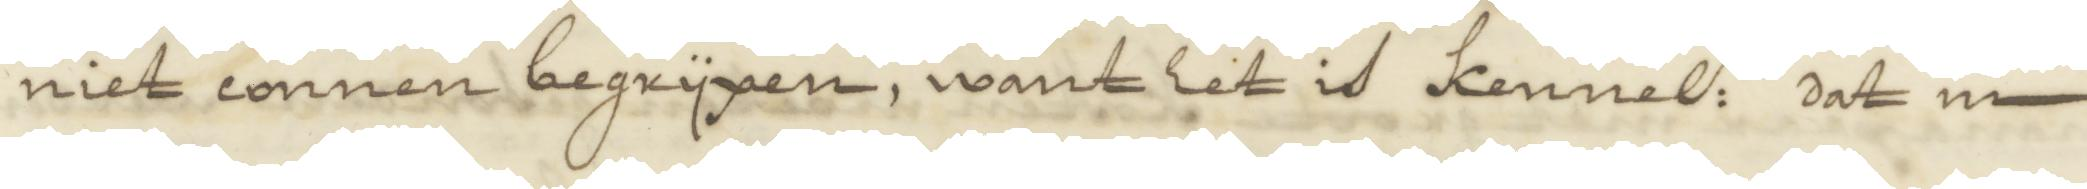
niet connen begrijpen, want het is kennelijk dat in
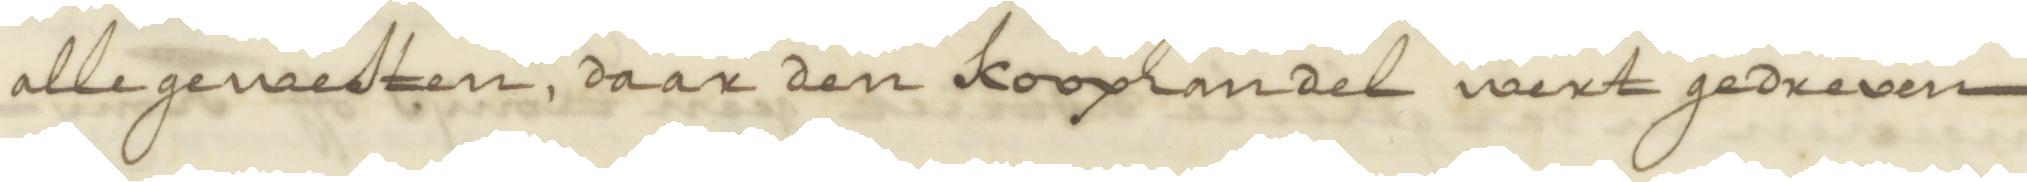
alle gewesten, daar den koophandel wert gedreven
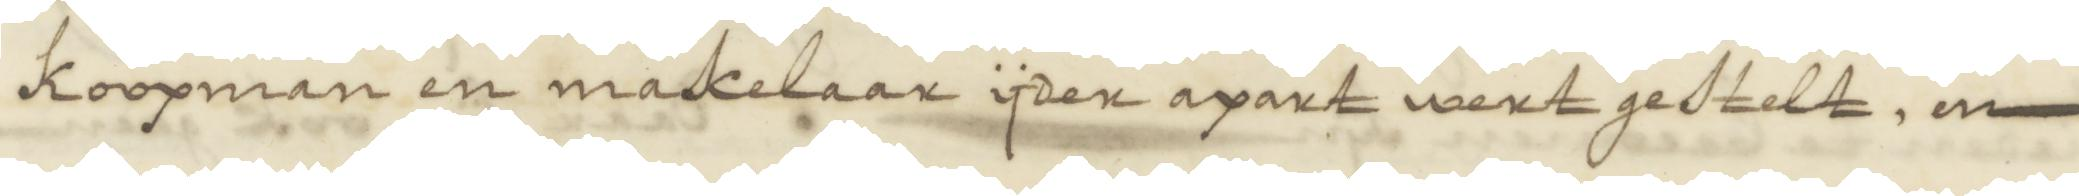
koopman en makelaar ijder apart wert gestelt, en
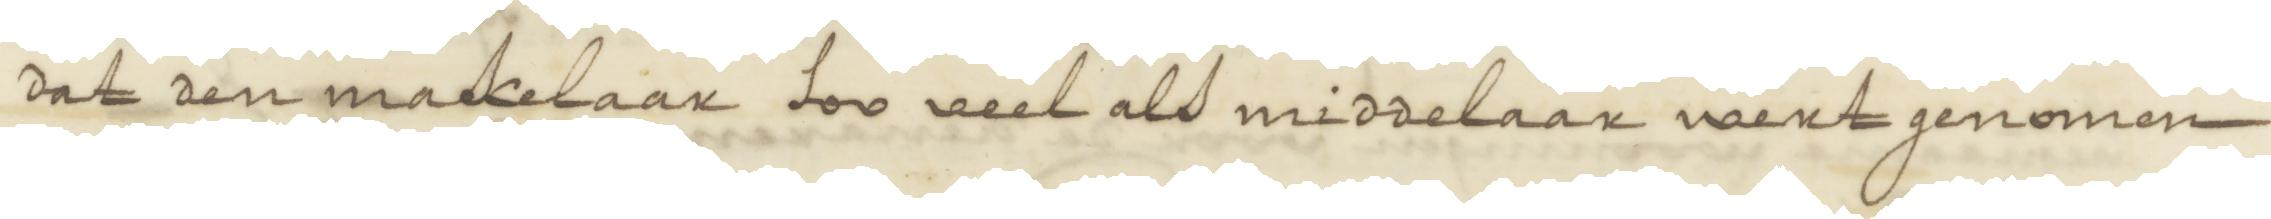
dat den makelaar soo veel als middelaar wert genomen
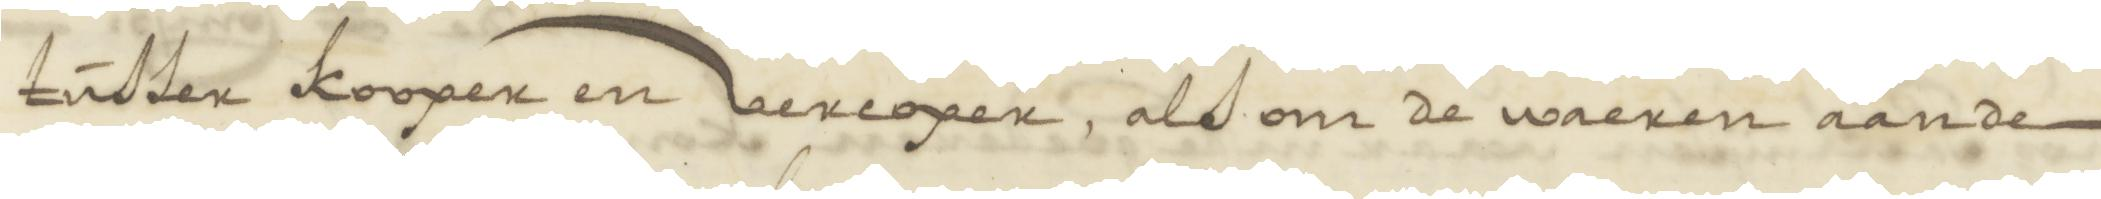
tusser kooper en vercopen, als om de waeren aande
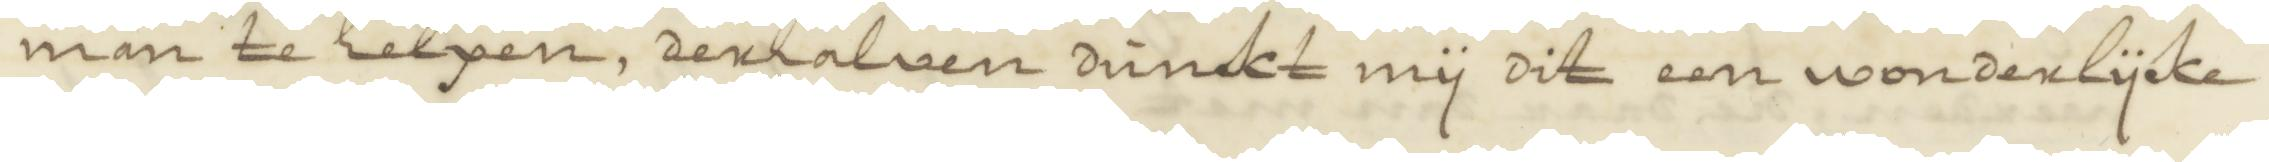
man te helpen, derhalven dunkt mij dit een wonderlijke
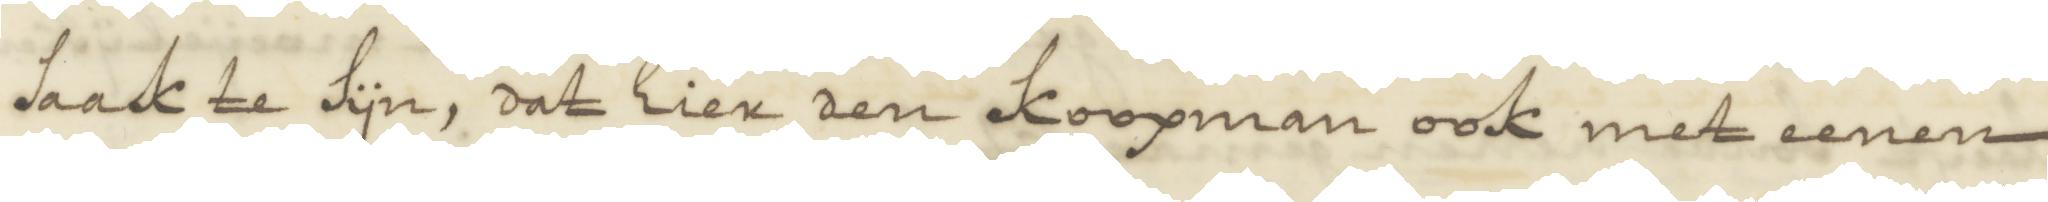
saak te sijn, dat hier den koopman ook met eenen
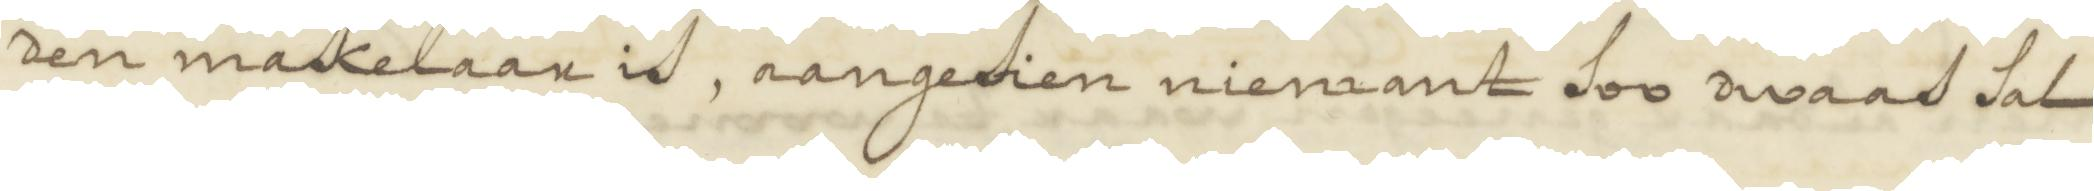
den makelaar is, aangesien niemant soo dwaas sal
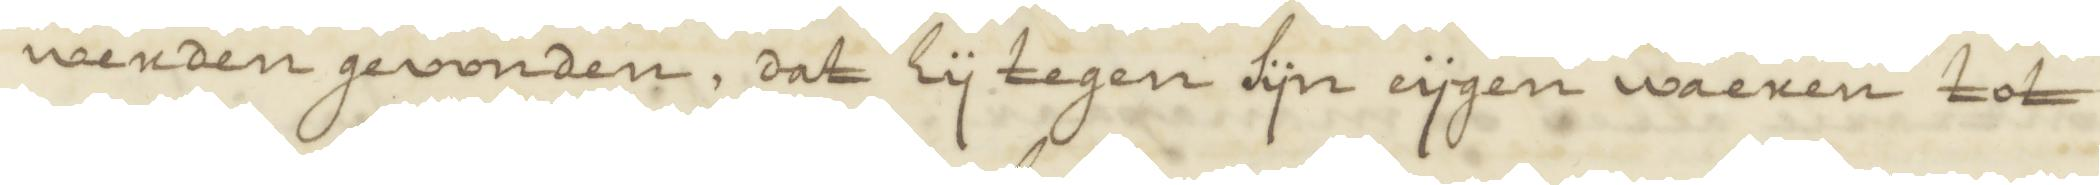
werden gevonden, dat hij tegen sijn eijgen waeren tot
